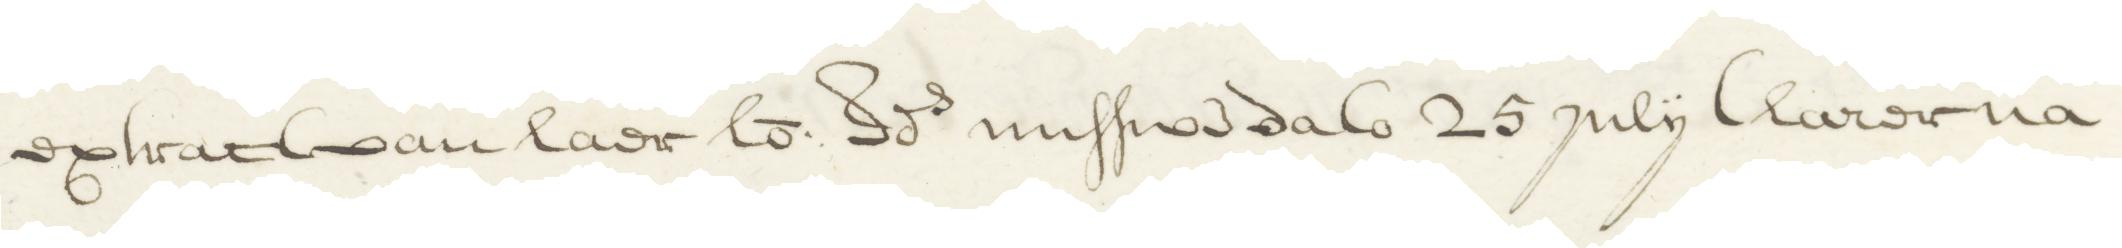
extract van haer ho: Eden missive dato 25 julij t harer na
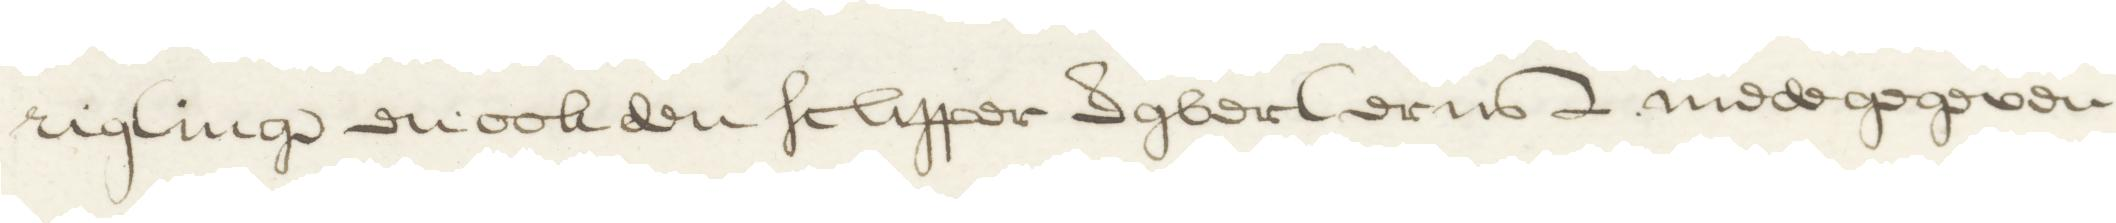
rigtinge en ook den schipper Egbert ernst mede gegeven
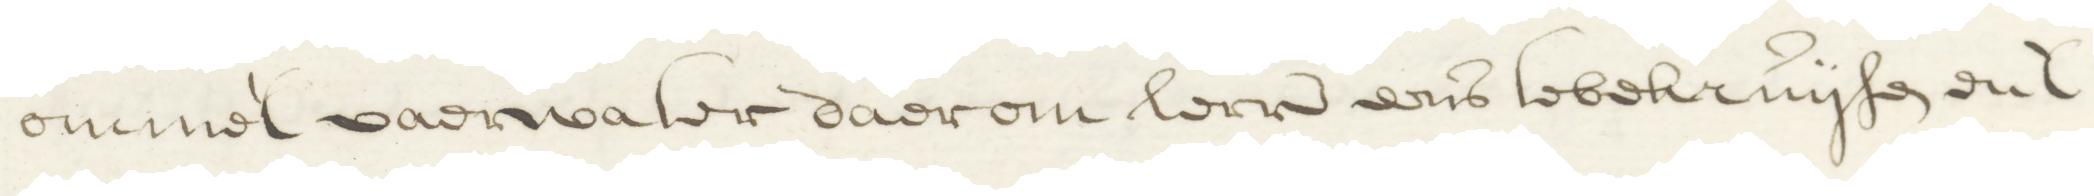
omme 't vaerwater daerom herre eens te bekruijsen en ’t
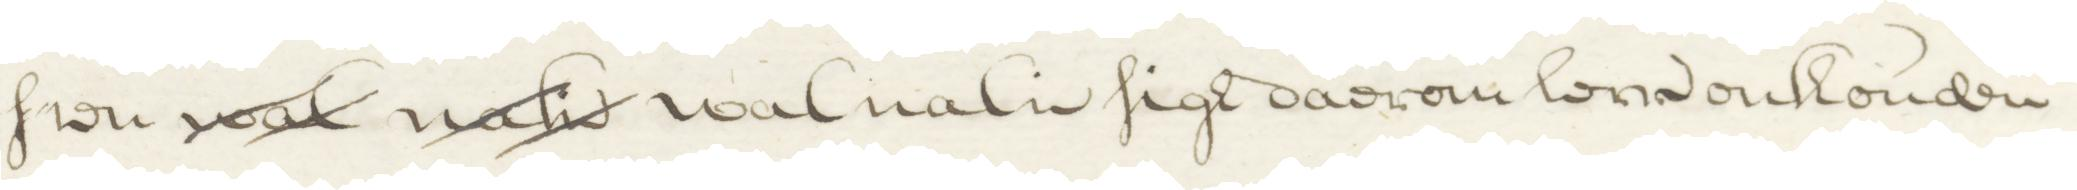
sien wat natie wat natie sigh daerom herre onthouden
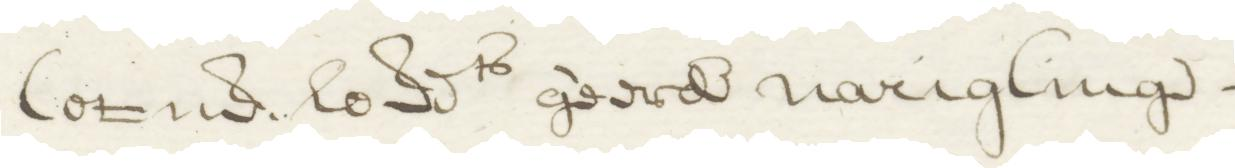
tot uE. ho Edts g'eerde narigtinge
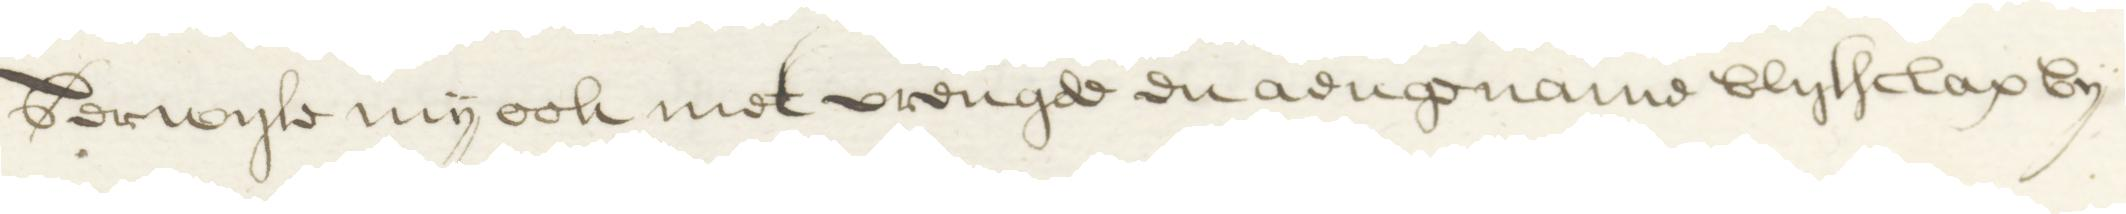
Terwyle mij ook met vreugde en aengename blijtschap bij
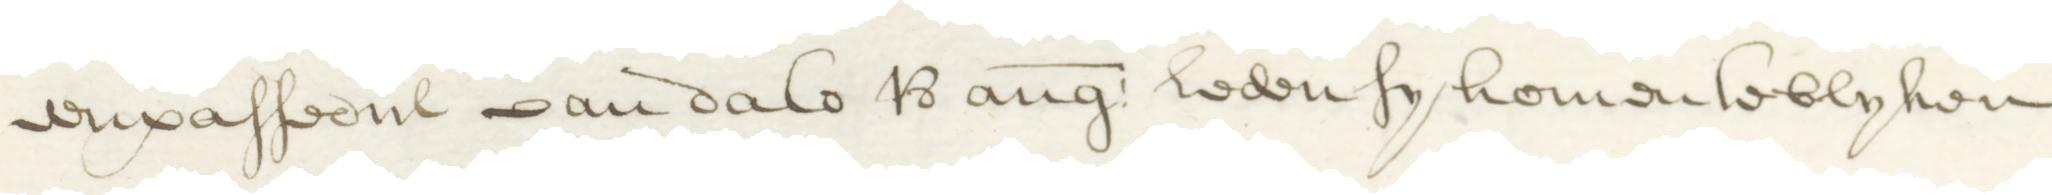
een passedul van dato 18 aug: heden sy komen te blyken
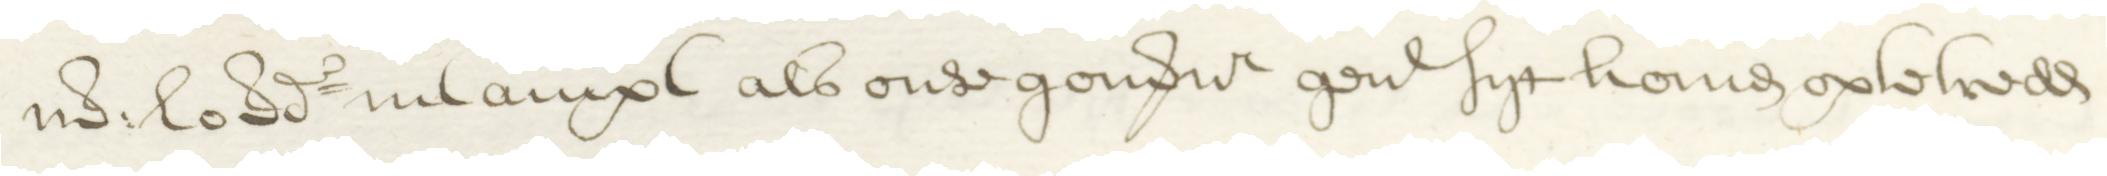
uE: ho Ed=e in t ampt als onse gouvernr genl syt komen op te treden
